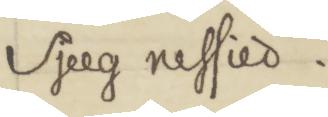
Sjeeg nessied
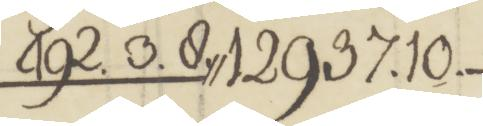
492.3.8„12937.10.
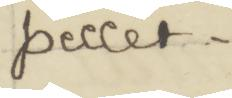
peccet
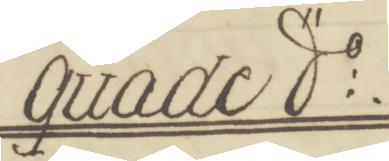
quade d:o
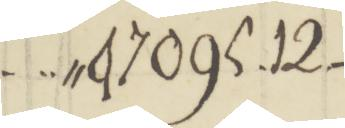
. . „47095.12
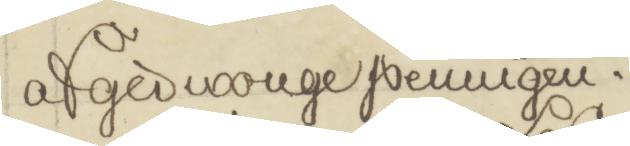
afgedwonge peningen
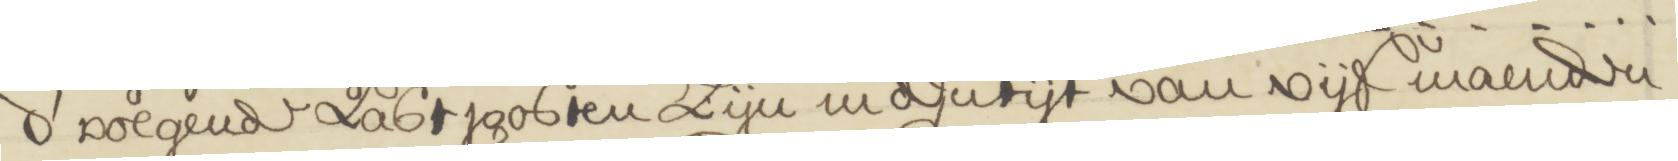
d’ volgende Lastposten zijn in den tijt van vijf maenden
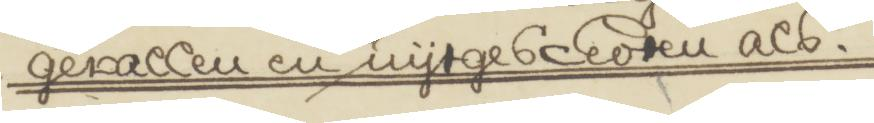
gevallen en uijtgeschoten als.
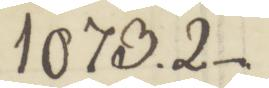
1073.2.–.
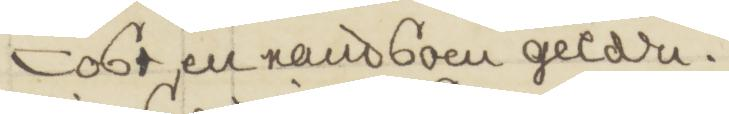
Cost, en randsoen gelden .
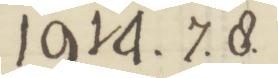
1914.7.8.
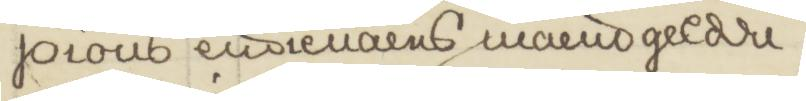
pions en dienaers maend gelden
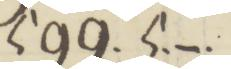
599.5.–.
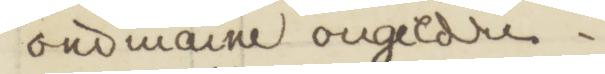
ordnaire ongelden -
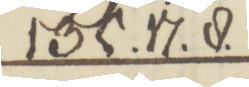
135:17.8.
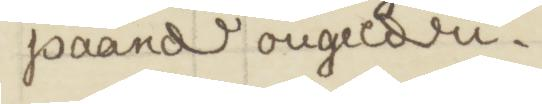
paarde ongelden -
